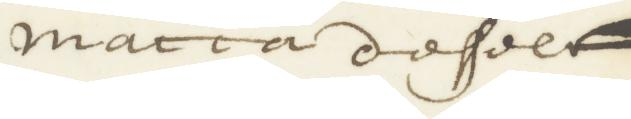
macca desselffs huijsv=w
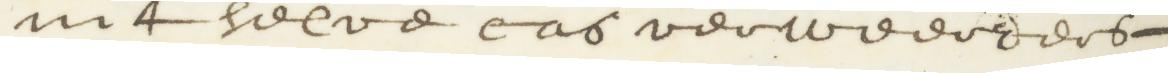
in t selve cas verweerders —
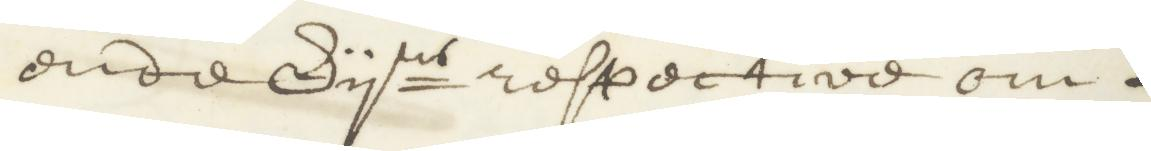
ende Eij=rs respective om —
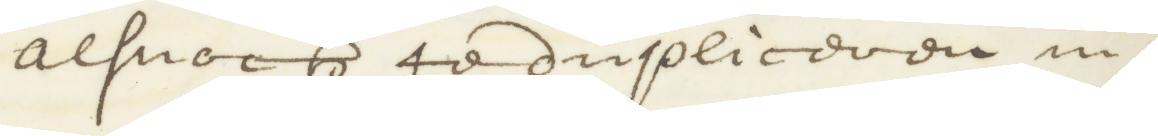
alsnoch te dupliceren in —
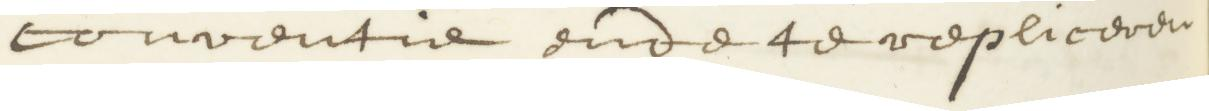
conventie ende te repliceren
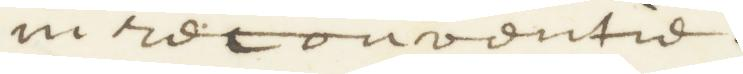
in reconventie —
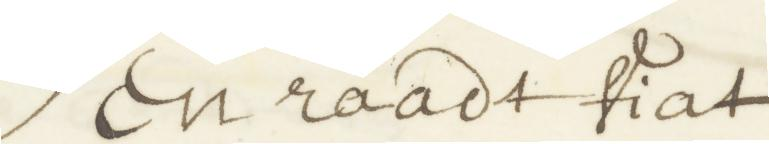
Den raadt Fiat
